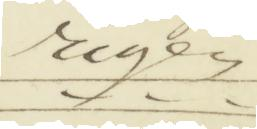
rigen
